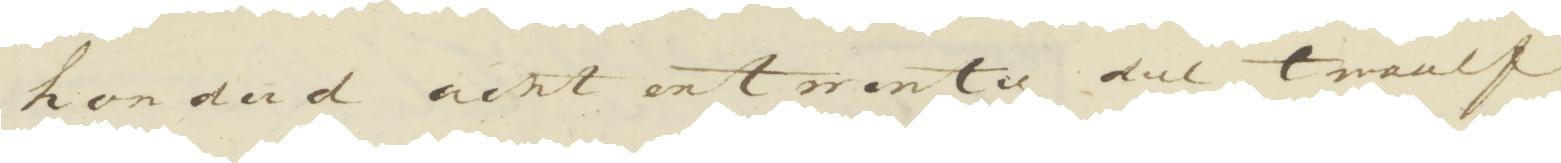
honderd acht en twintig deel twaalf
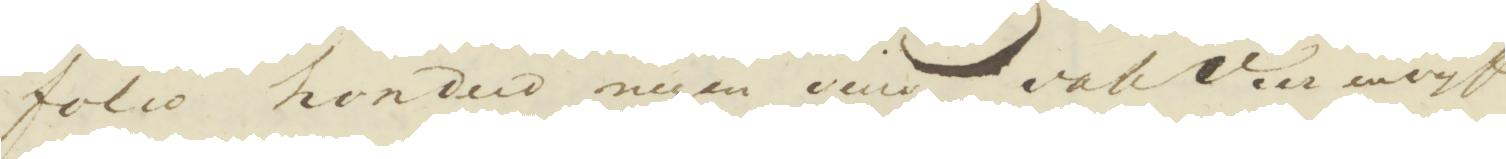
folio honderd negen verso, vak Vier en vyf
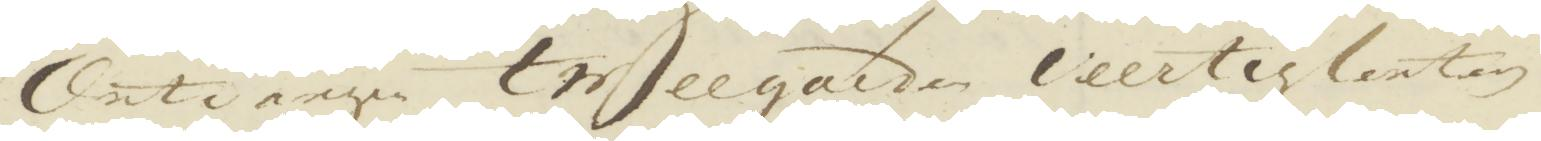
Ontvangen twee gulden veertig Centen
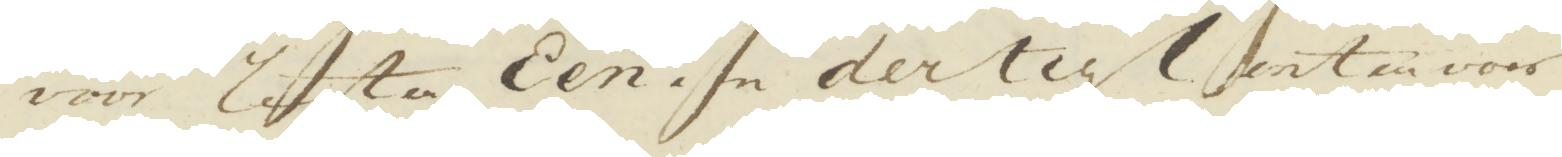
voor regten, Een en dertig Centen voor
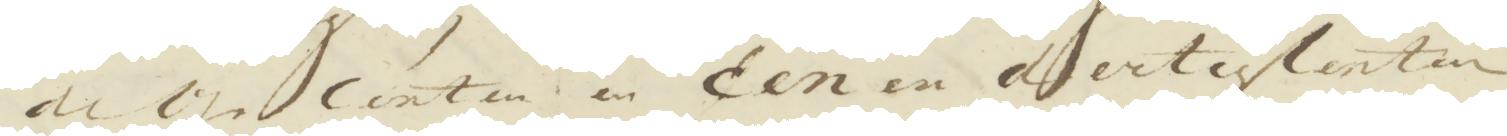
de op centen en Een en dertig Centen
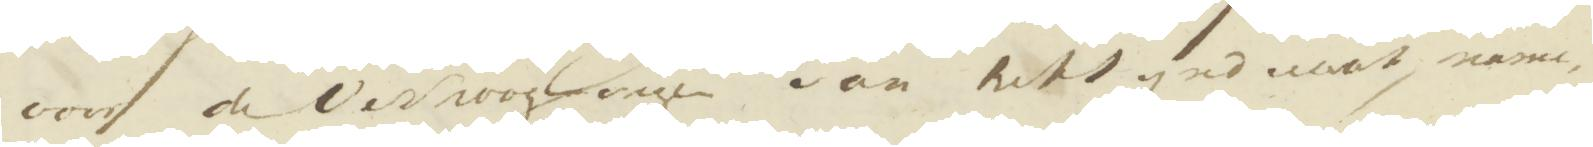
voor de verhoogingen van het syndicaat, name,
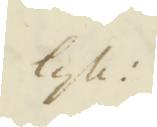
lyk:
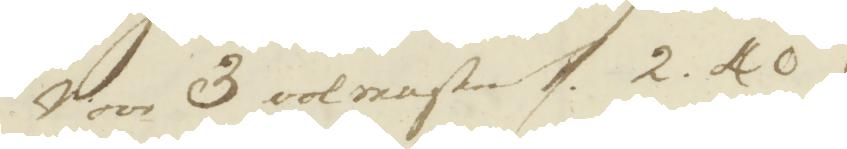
Voor 3 volmagten ƒ. 2.40
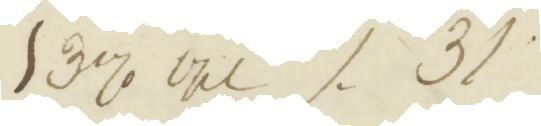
13%„ Opc ƒ. 31
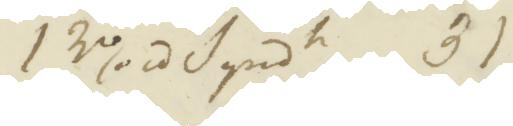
13% d syndt 31
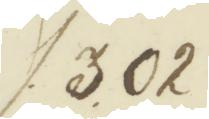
ƒ3.02
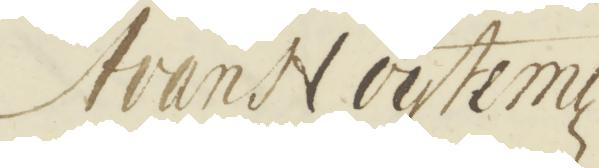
Avan Nogtems
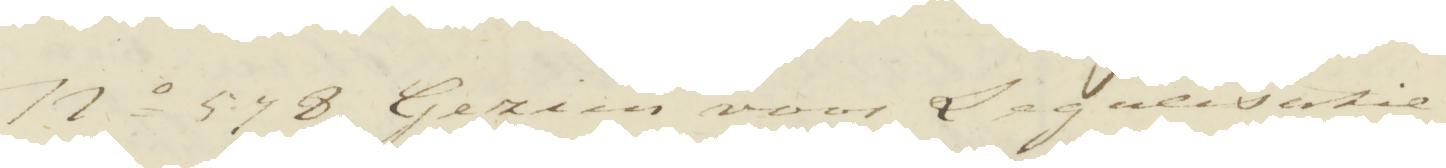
N=o 578 Gezien voor Legalisatie
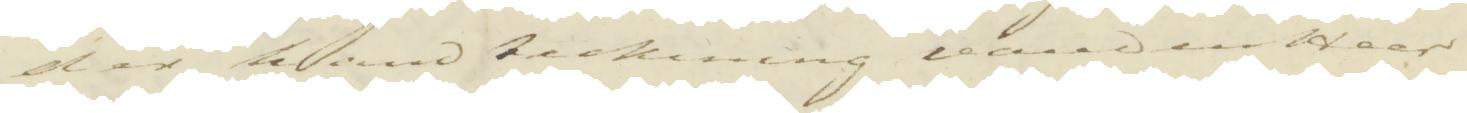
der hand teekening van den Heer
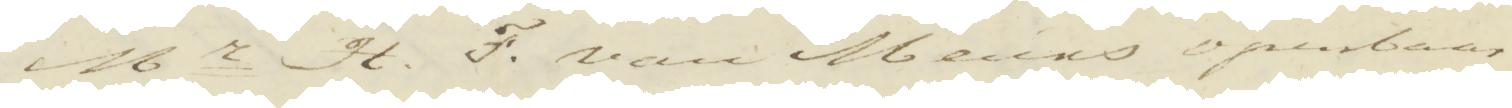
M=r H. F. van Meurs openbaar
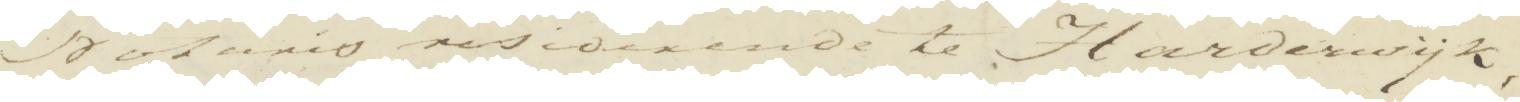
Notaris residerende te Harderwijk,
